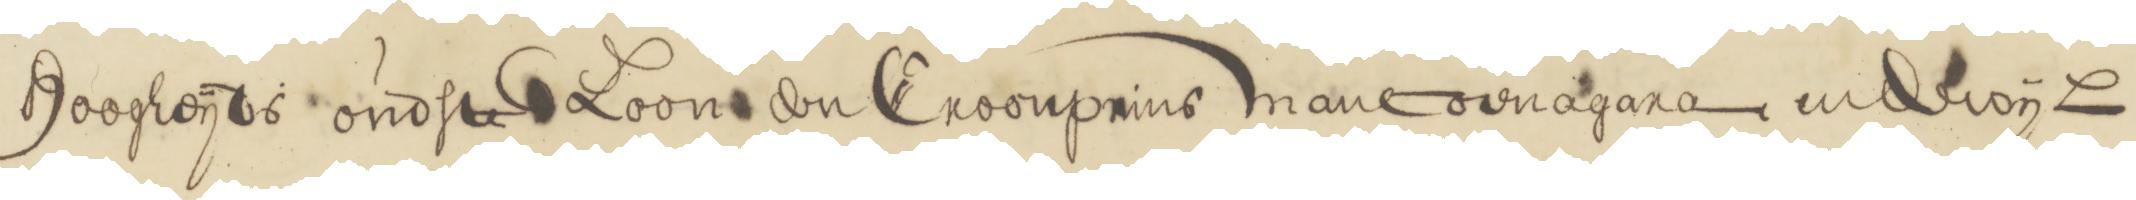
Hoogheijds oudste Zoon den Croonprins mancoenagara, indewijl
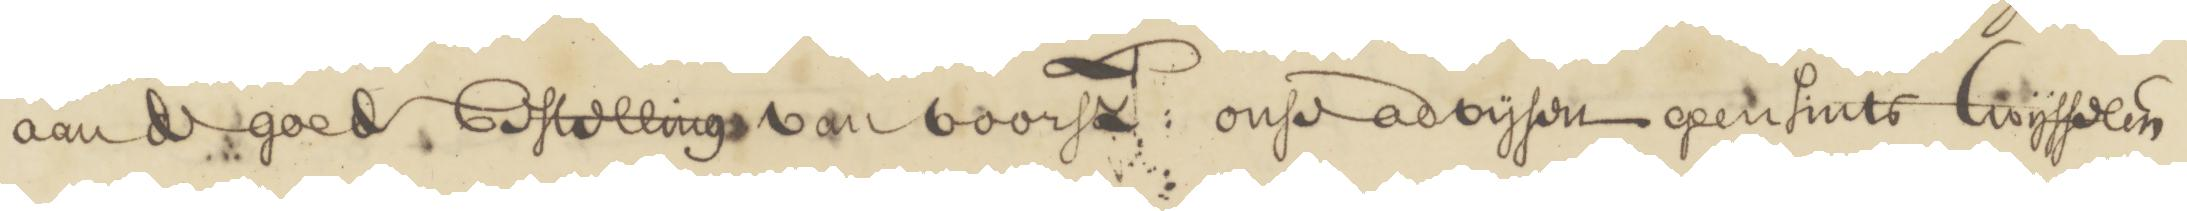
aan de goede bestelling van voorsz: onse advijsen geensints twijffelen
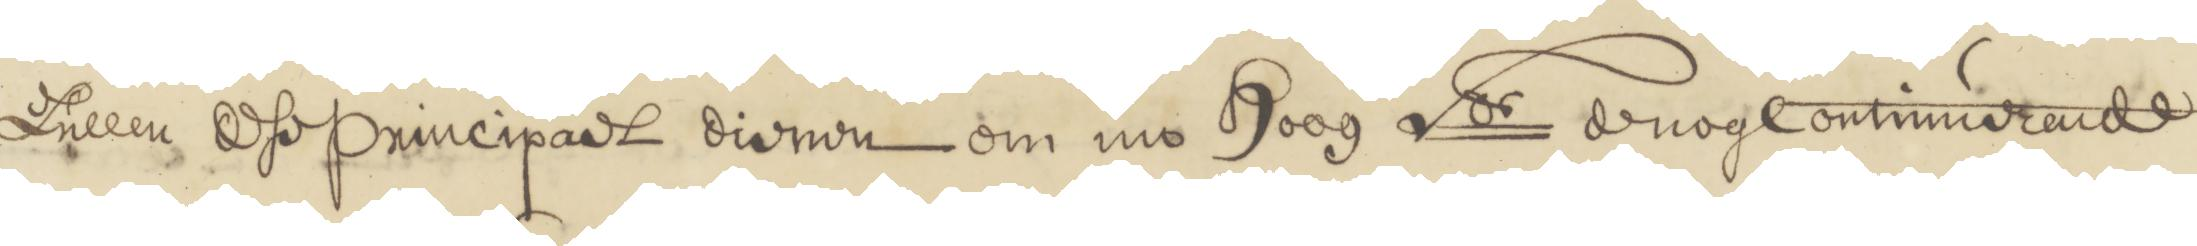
Zullen dese principael dienen om uw Hoog E=ds de nog continuerende
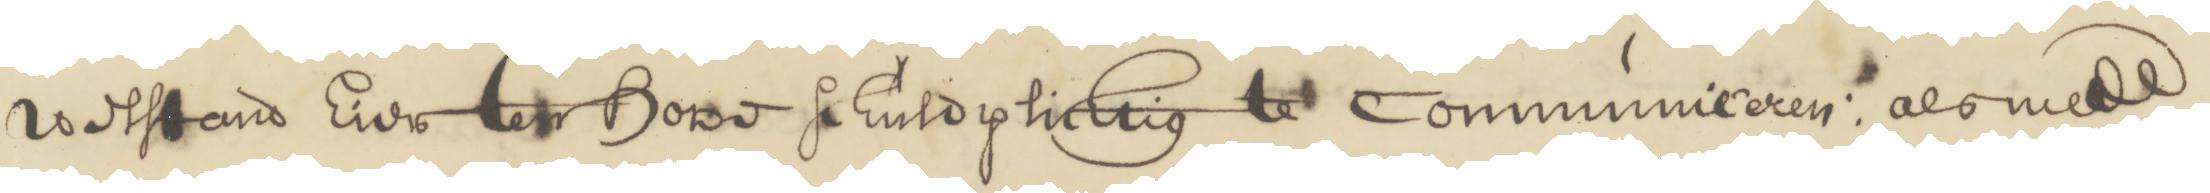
welstand hier ter Hove schuldplichtig te communiceren: als mede
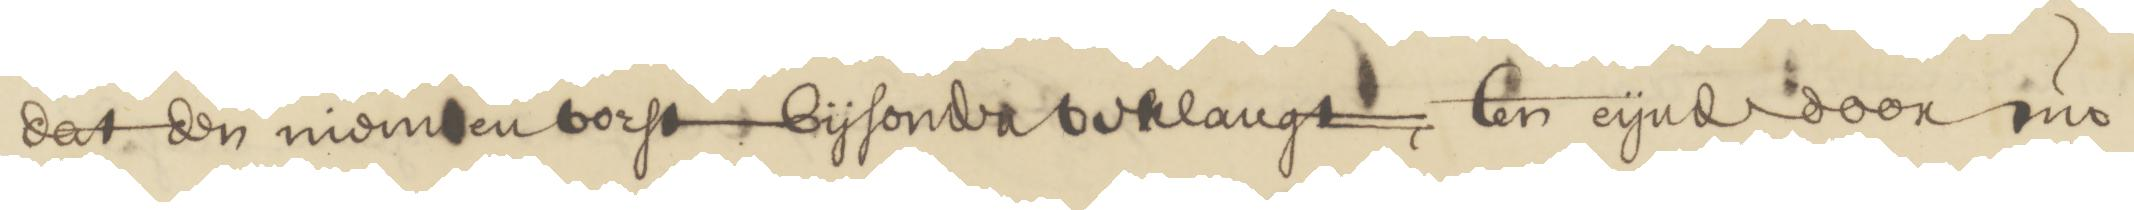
dat den nieuwen vorst bijsonder verlangt, ten eijnde door uw
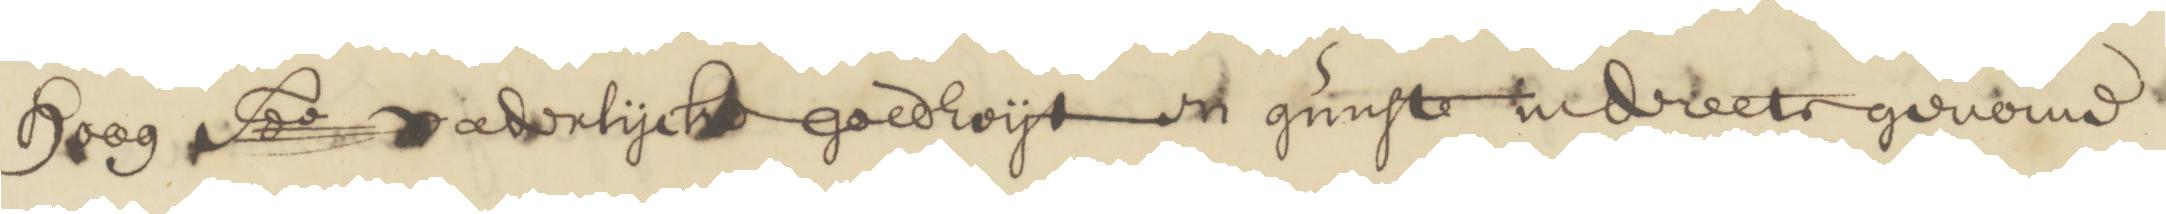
Hoog Ed=e vaderlijcke goedheijt en gunste in de reets genome
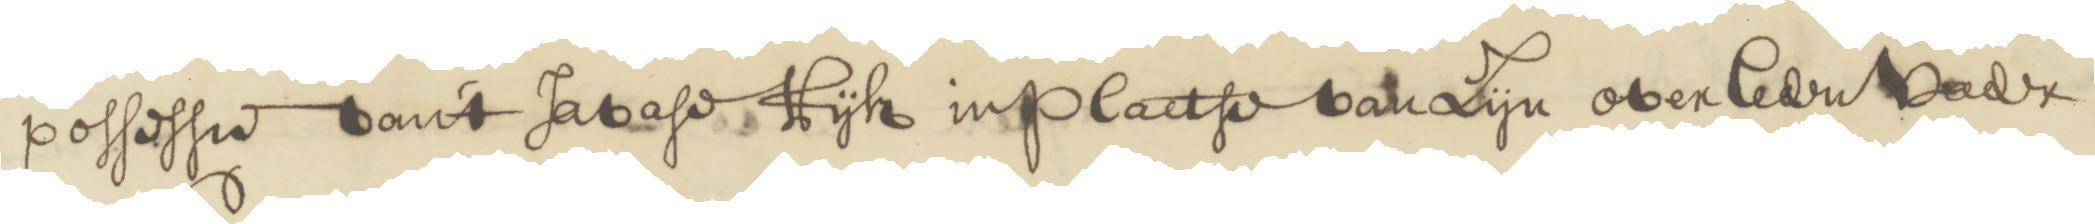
possessie van’t Javase Rijk inplaetse van Zijn overleden vader
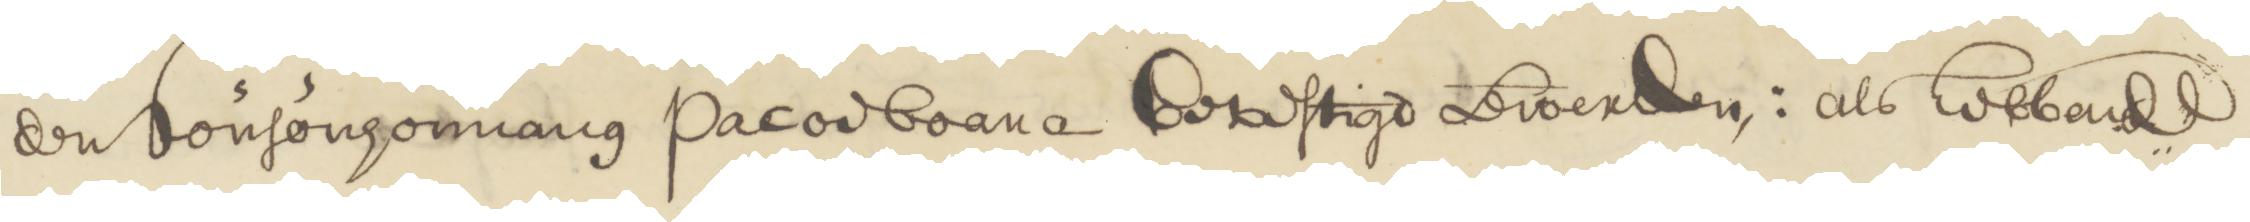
den Sousouhounang Pacoeboara bevestigd te werden, : als hebbende
